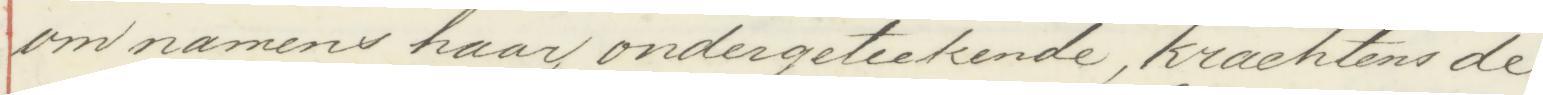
om namens haar ondergeteekende, krachtens de
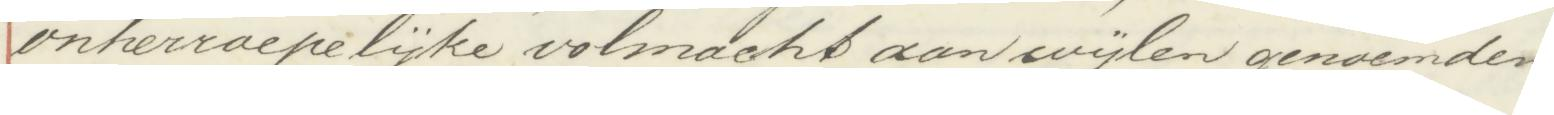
onherroepelijke volmacht aan wijlen genoemden
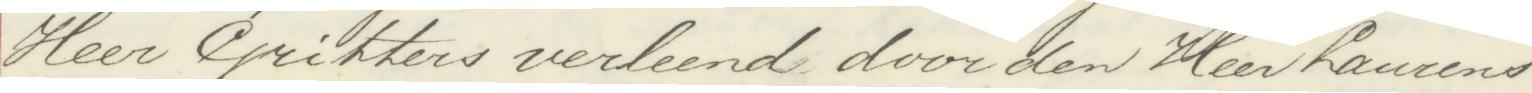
Heer Gritters verleend door den Heer Laurens
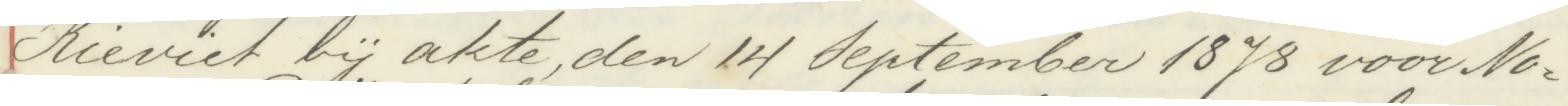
Kieviet bij akte, den 14 September 1878 voor No=
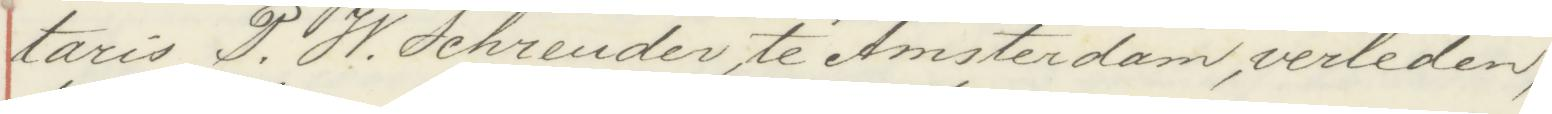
taris P. W. Schreuder, te Amsterdam, verleden,
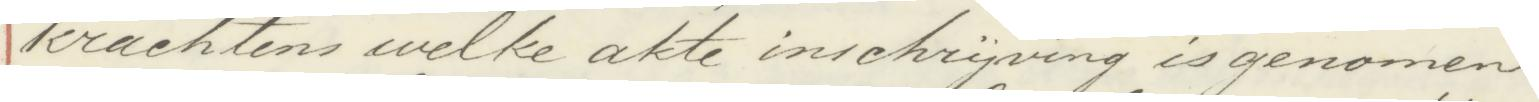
krachtens welke akte inschrijving is genomen
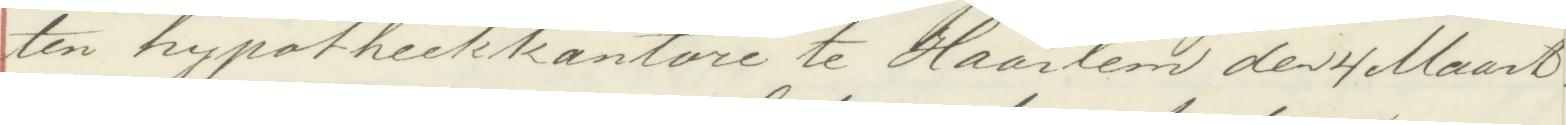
ten hypotheekkantore te Haarlem den 4 Maart
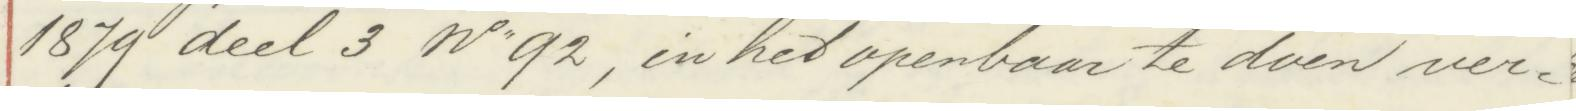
1879 deel 3 No" 92, in het openbaar te doen ver=
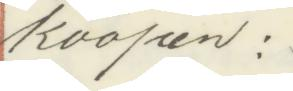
koopen:
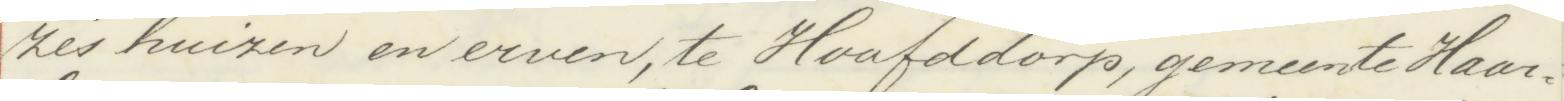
zes huizen en erven, te Hoofddorp, gemeente Haar„
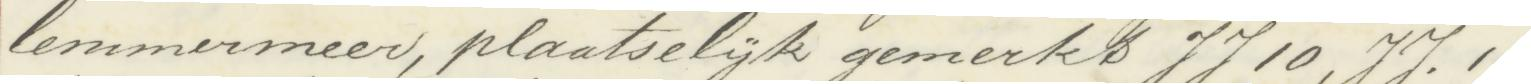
lemmermeer, plaatselijk gemerkt JJ10, JJ. 11
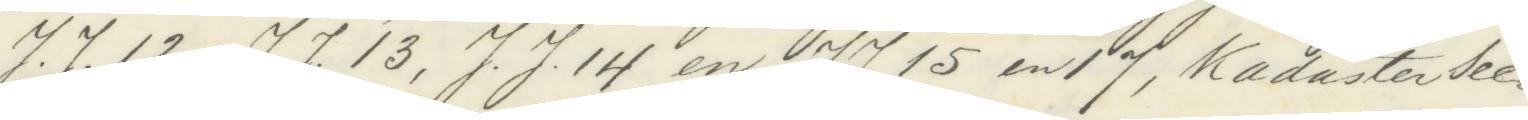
J.J. 12, J.J. 13, J.J. 14 en JJ 15 en 17, kadaster sec
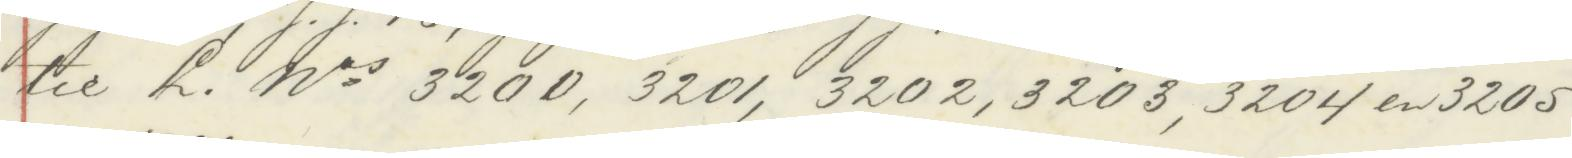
tie L. N=rs 3200, 3201, 3202, 3203, 320 en 3205
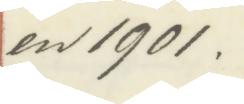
en 1901.
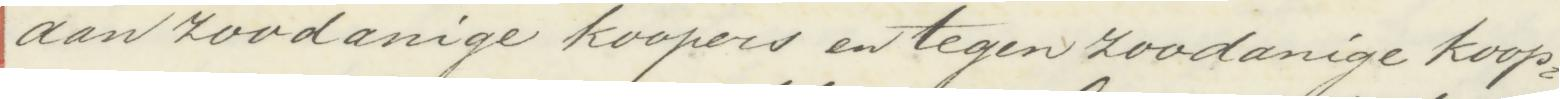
aan zoodanige koopers en tegen zoodanige koop=
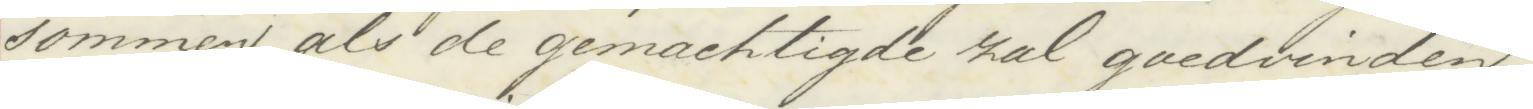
sommen als de gemachtigde zal goedvinden
